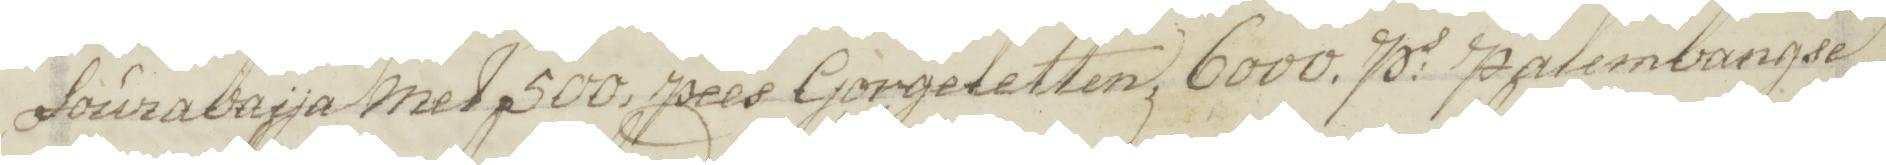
sourabaija met 500, pees Gorgeletten, 6000. p:s palembangse
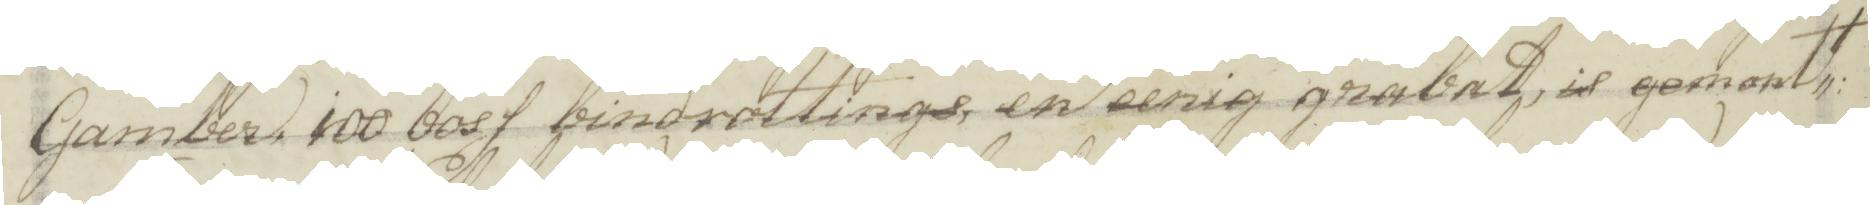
Gamber, 100 boss bindrottings, en eenig grabat, is gemont„t
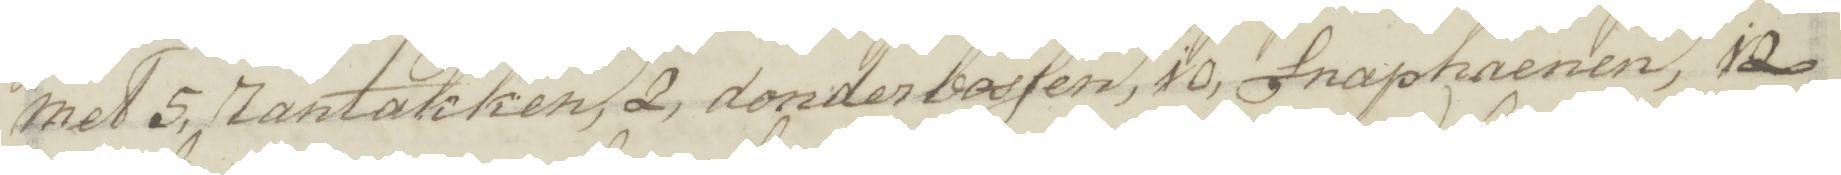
met 5. rantakken, 2, donderbossen, 10, Snaphaenen, 12
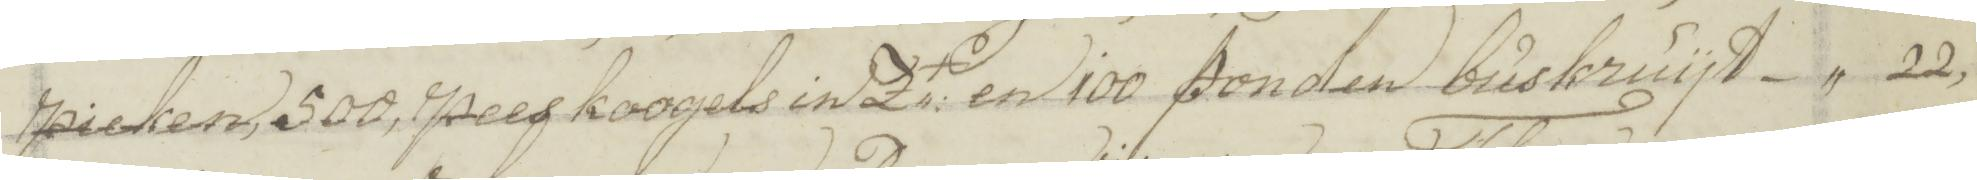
pieken, 500, pees koogels in Z„:t en 100 ponden buskruijt - „ 22,
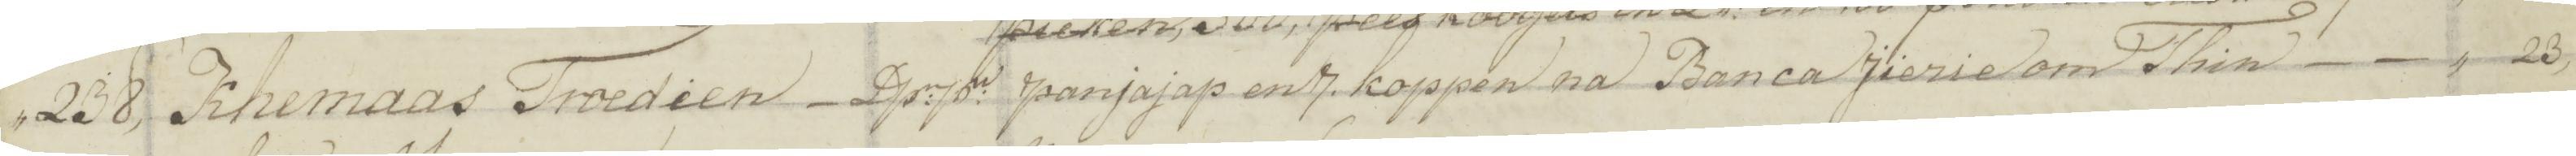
„ 238 Khemaas Troedien — Dp:r p:w panjajap en 7. koppen na Banca Jierie om Thin - - „ 23,
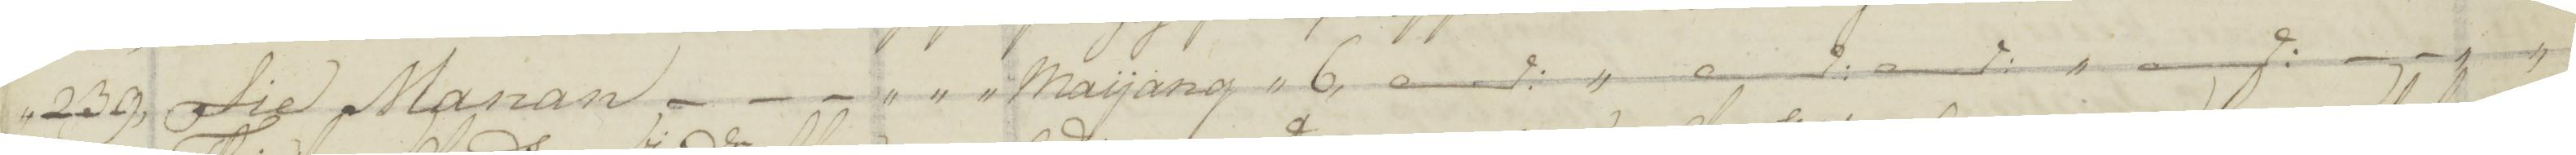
„ 239, Sie Manan - - - „ „ „ Maijang „ 6, _:o „ _:o _:o „ _:o - - „
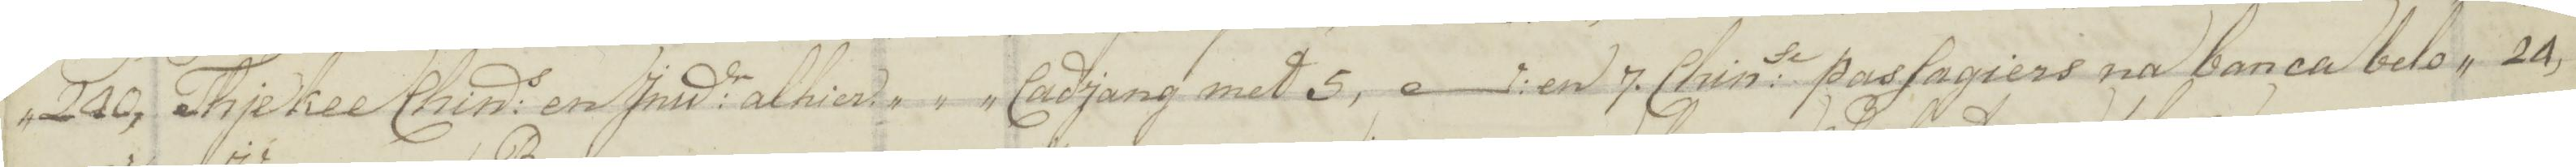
„ 240, Thjekee Chin:s en Jnw:r alhier „ „ „ Cadjang met 5, _:o en 7. Chin:se passagiers na banca belo „ 24,
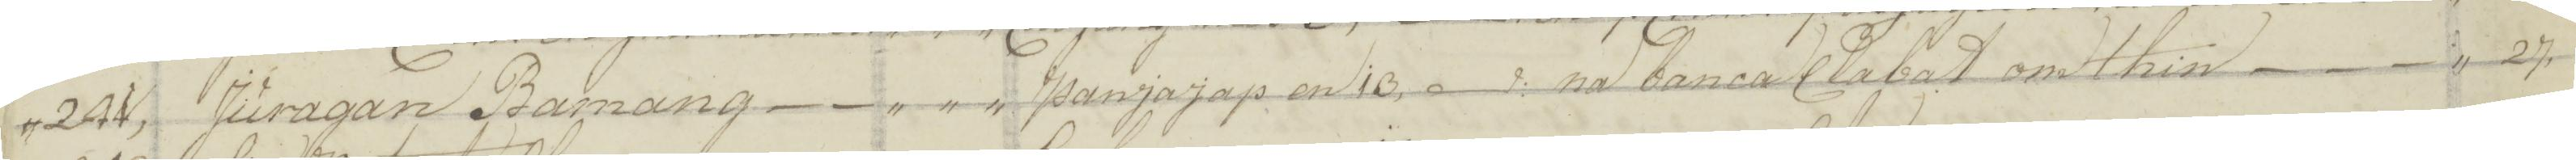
„ 241, Juragan Bamang - - „ „ „ panjajap en 13, _:o na banca Clabat om thin - - - „ 27.
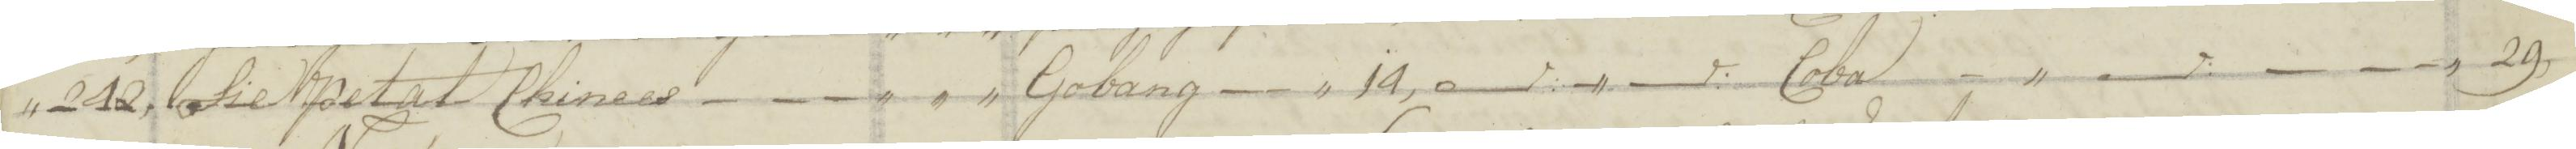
„ 242, Sie petat Chinees - - - „ „ „ Gobang - - „ 14, _:o „ _:o Coba - „ _:o - - - „ 29,
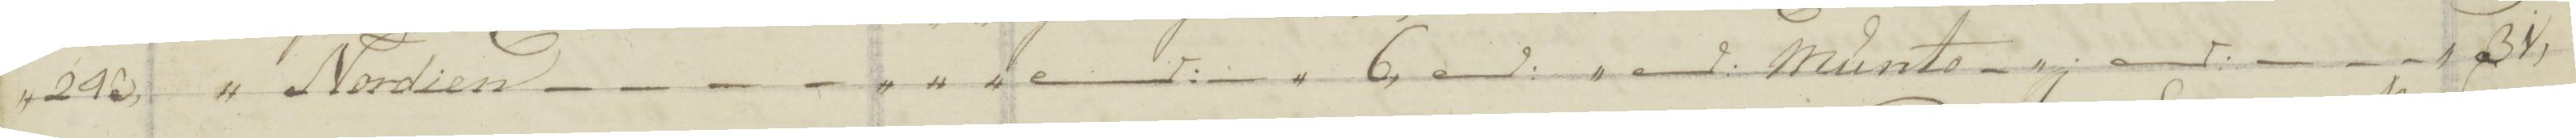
„ 243: „ Nordien - - - - „ „ „ _:o - „ 6 _:o „ _: Munte - „ _:o - - - „ 31,
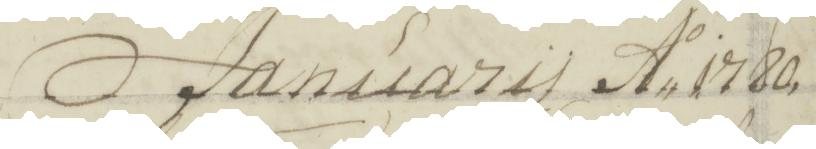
Januarij A„o 1780,
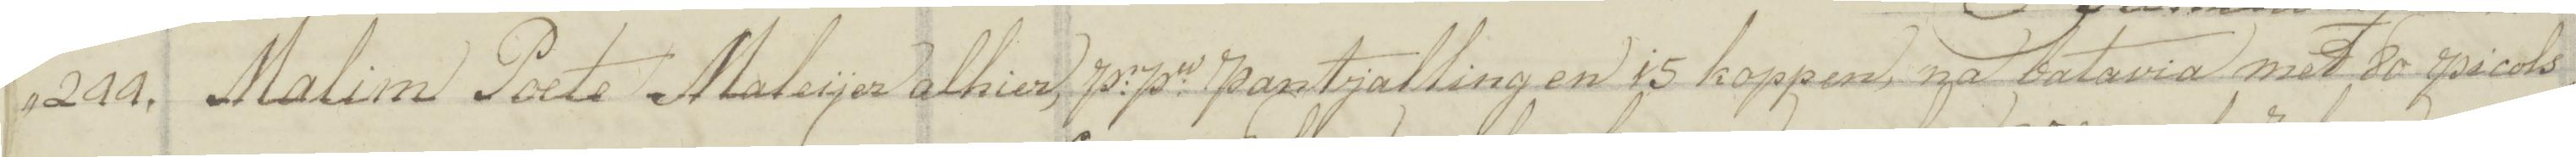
„ 244. Malim Poete Maleijer alhier, p:r p:w pantjalting en 15 koppen, na batavia met 80 picols
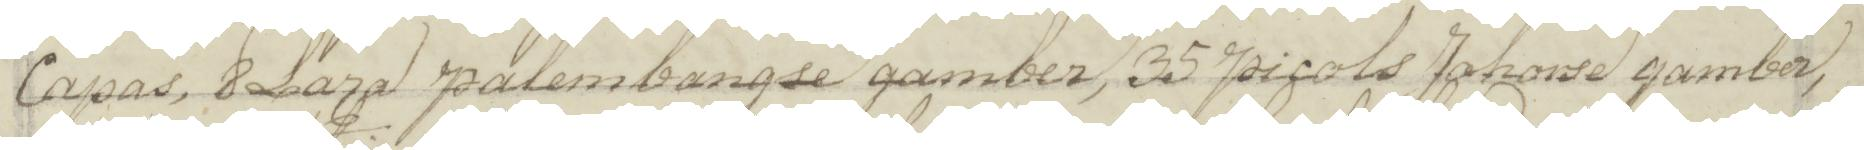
Capas, 8 Laxa palembangse gamber, 35 picols Johorse gamber,
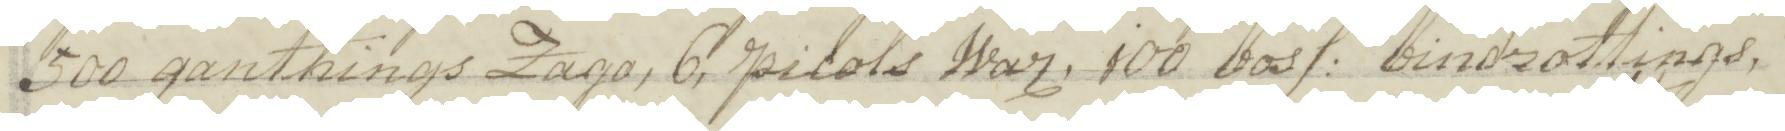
500 ganthings Zago, 6, picots wax, 100 boss: bindrottings,
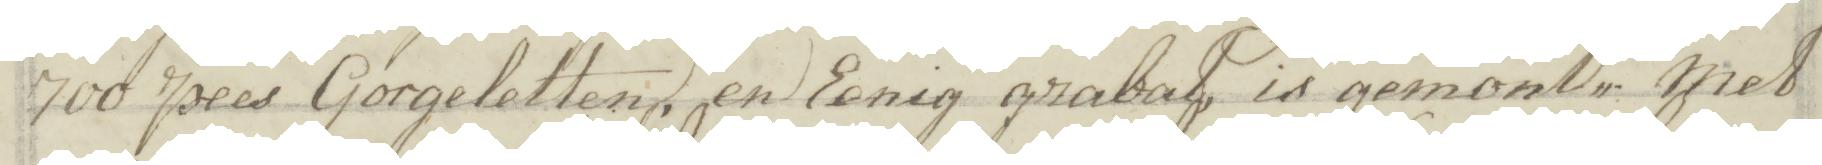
700 pees Gorgeletten, en Eenig grabat, is gemont„ met
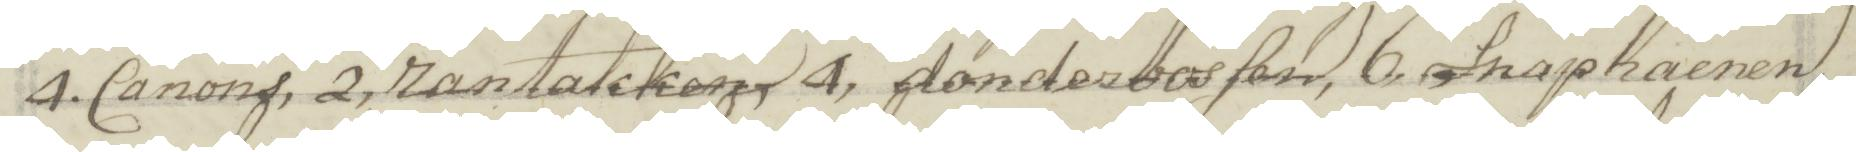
4. Canons, 2, rantakken, 4, donderbossen, 6. Snaphaenen
